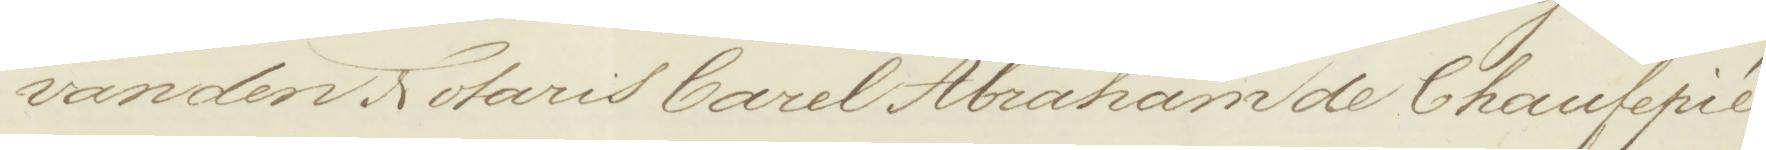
van den Notaris Carel Abraham de Chaufepié
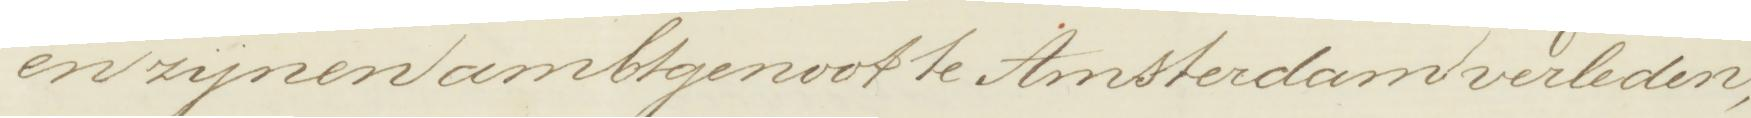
en zijnen ambtgenoot te Amsterdam verleden
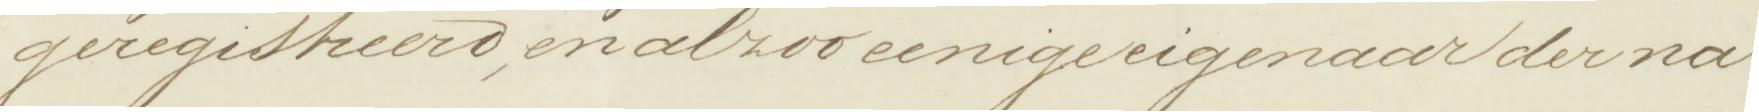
geregistreerd, en alzoo eenige eigenaar der na
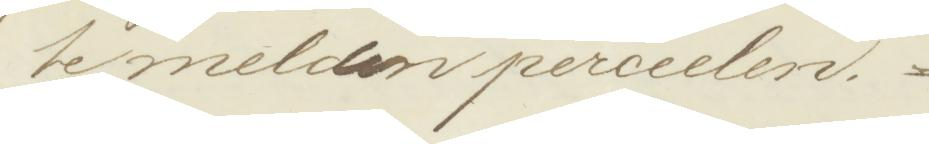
te melden perceelen.=
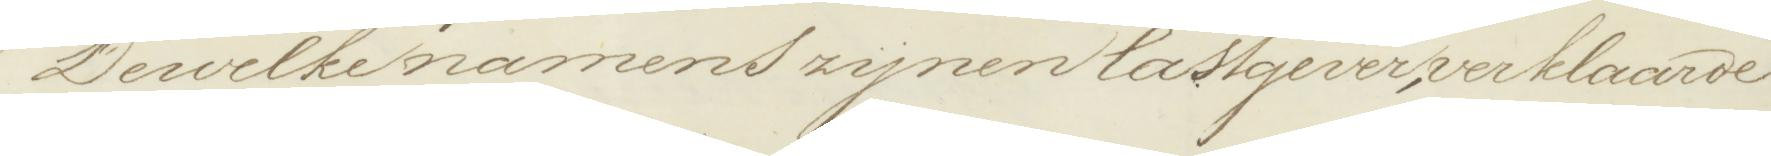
Dewelke namens zijnen lastgever, verklaarde
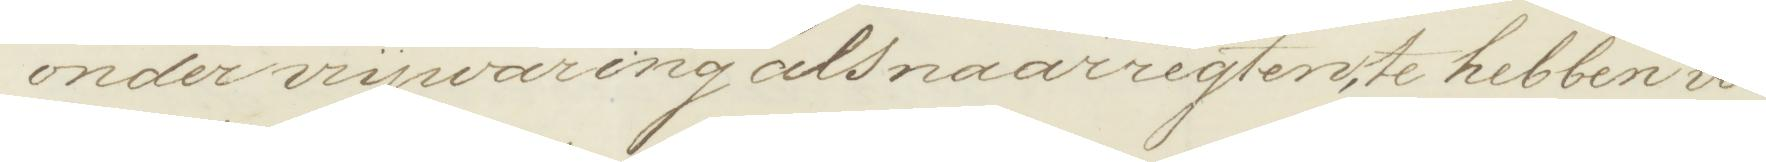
onder vrijwaring als naar regten, te hebben ver
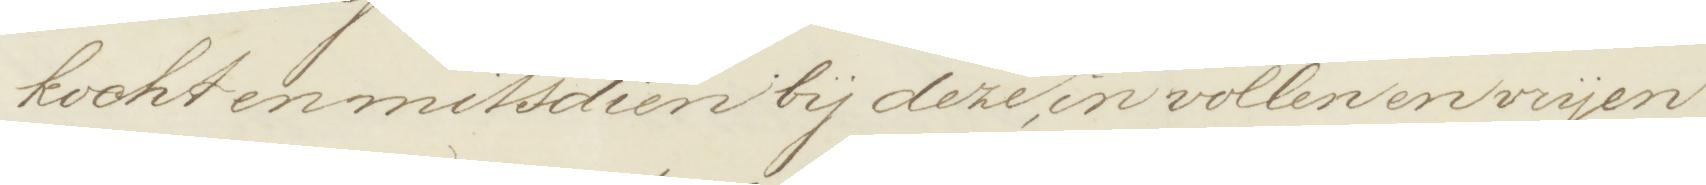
kocht en mitsdien bij deze, in vollen en vrijen
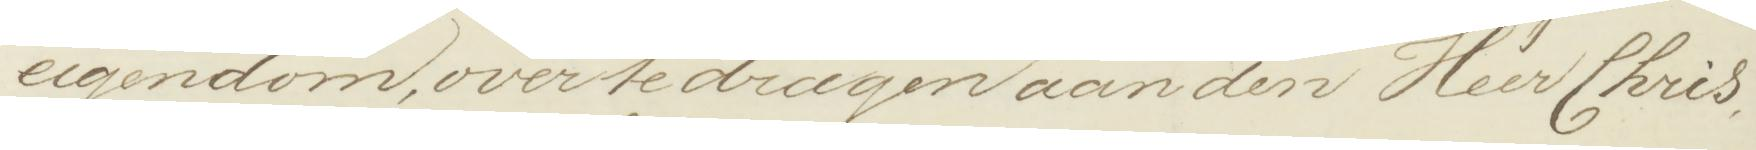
eigendom, over te dragen aan den Heer Chris,
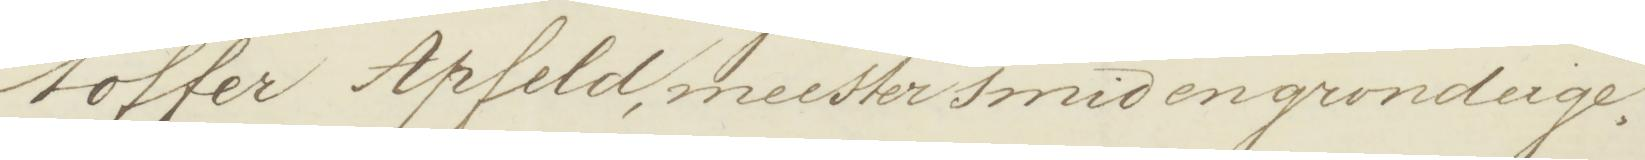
toffer Apfeld, meester smid en grondeige,
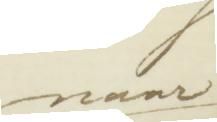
naar
